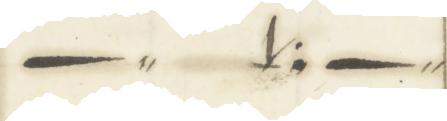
— „ 1: —„
